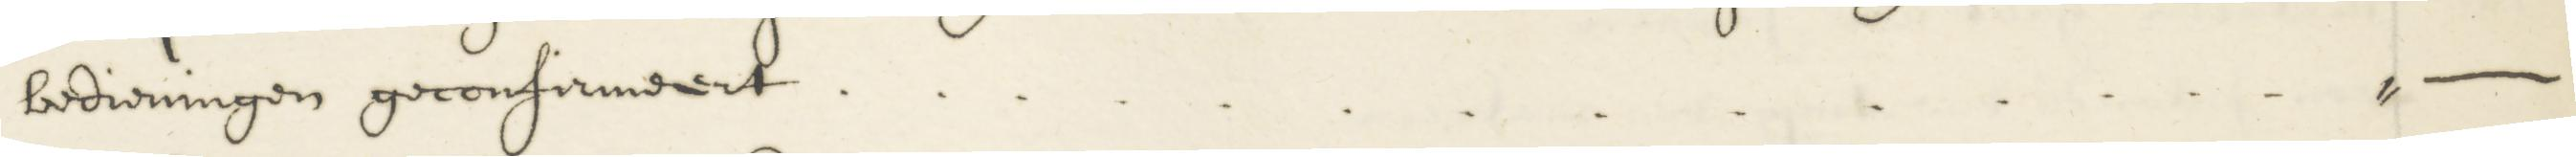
bedieningen geconfirmeert - - - - - - - - - - - - - - „ —
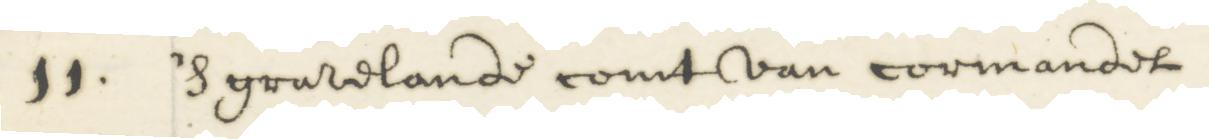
11. ’s gravelande comt van cormandel
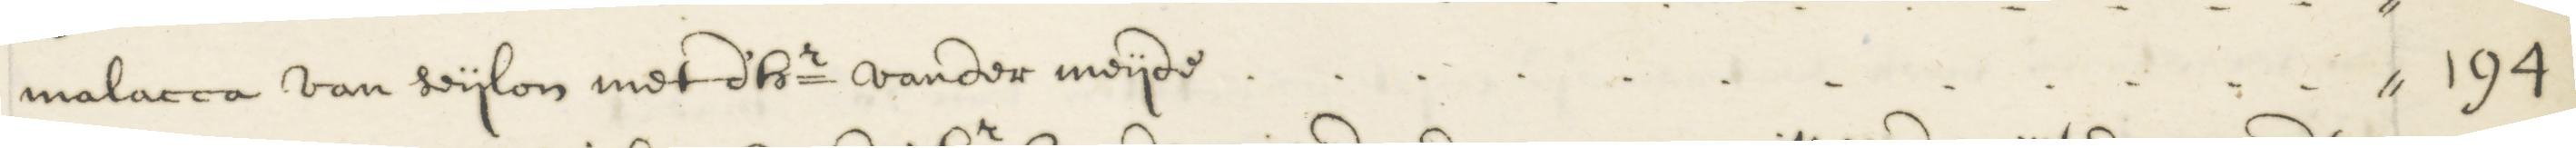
malacca van seijlon met d' H=r vander meijde - - - - - - - - - - - - „ 194
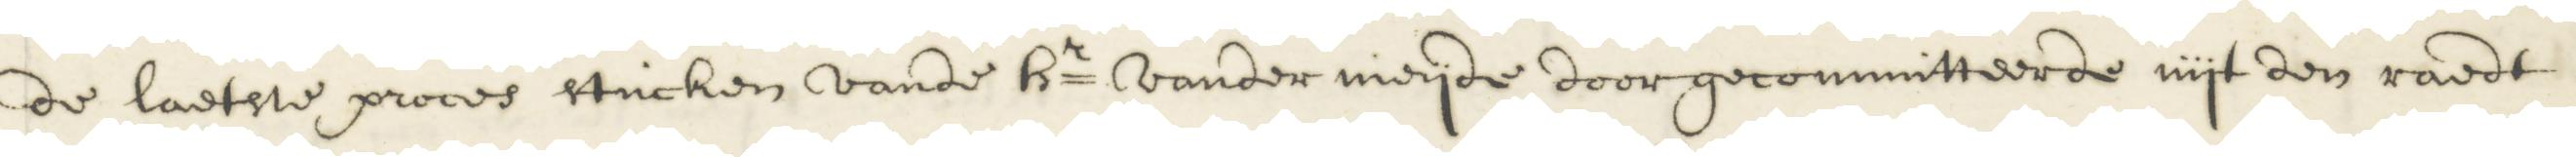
de laetste proces stucken vande H:r vander meijde door gecommitteerde uijt den raedt
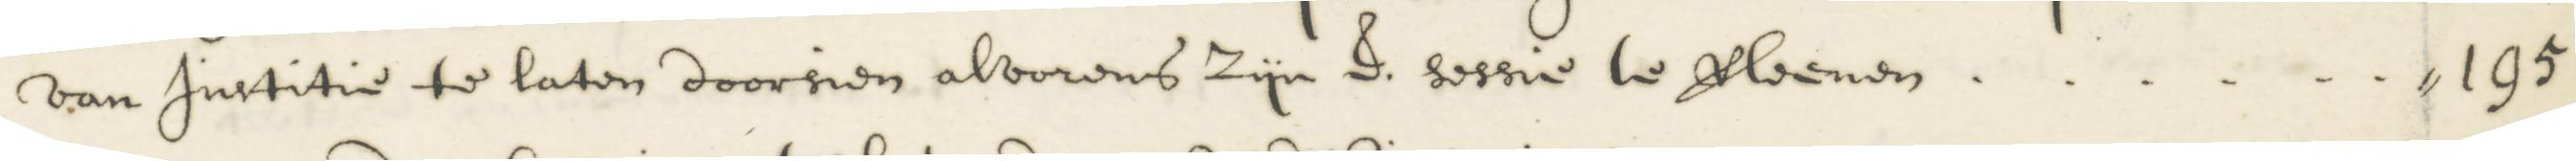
van Justitie te laten doorsien alvorens zijn E. sessie te verleenen - - - - - - „ 195
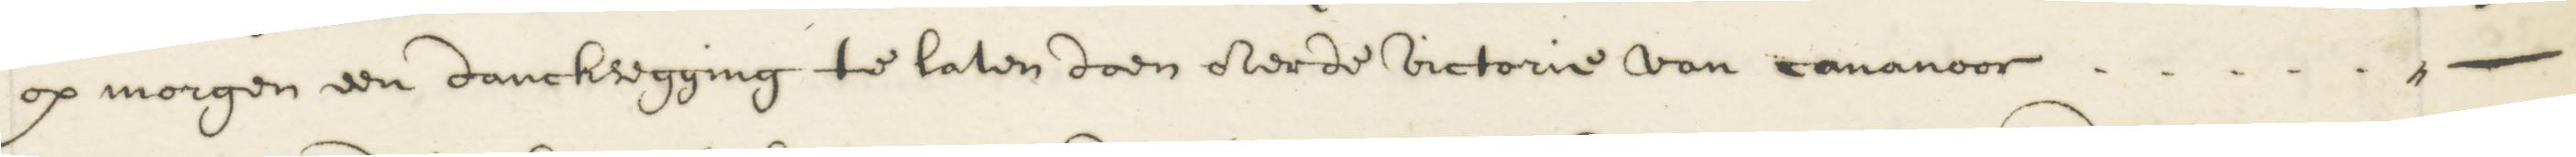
op morgen een dancksegging te laten doen over de victorie van cananoor - - - - - „ —
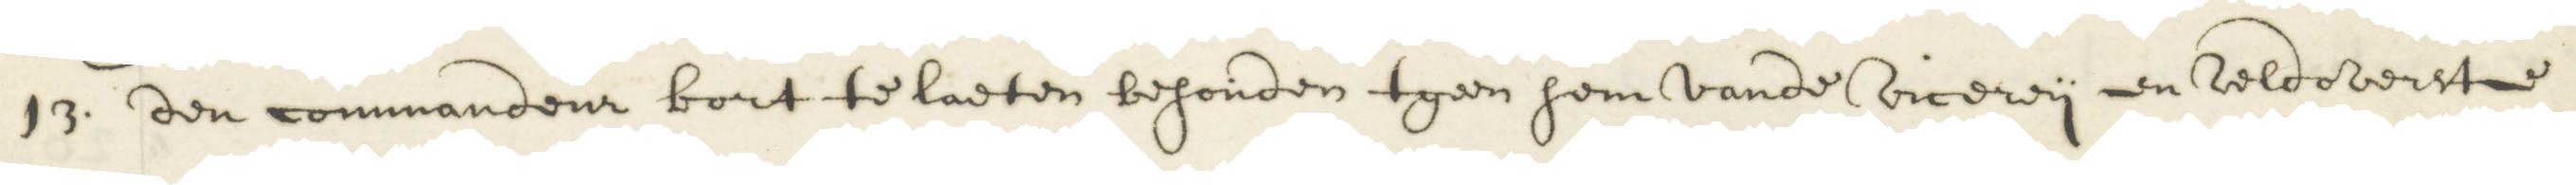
13. den commandeur bort te laeten behouden tgeen hem vande vicereij en veldoverste
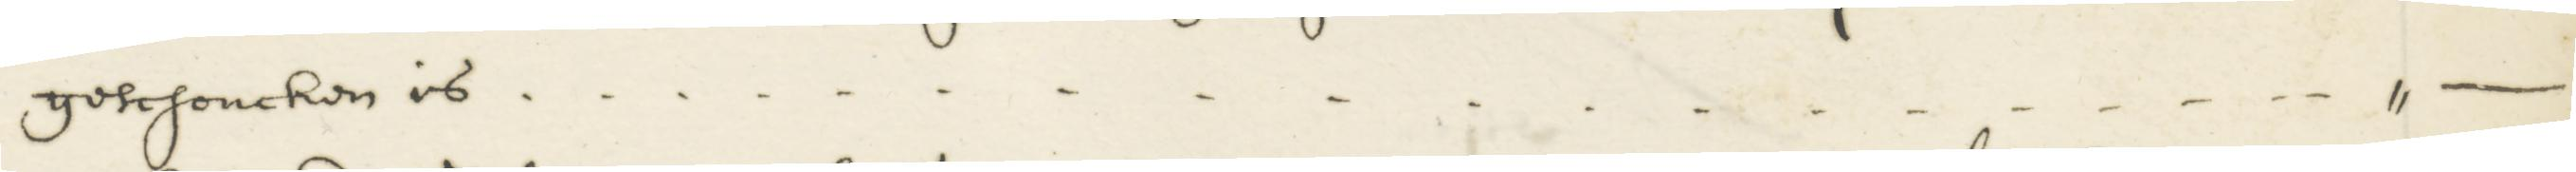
geschoncken is - - - - - - - - - - - - - - - - - - - „ —
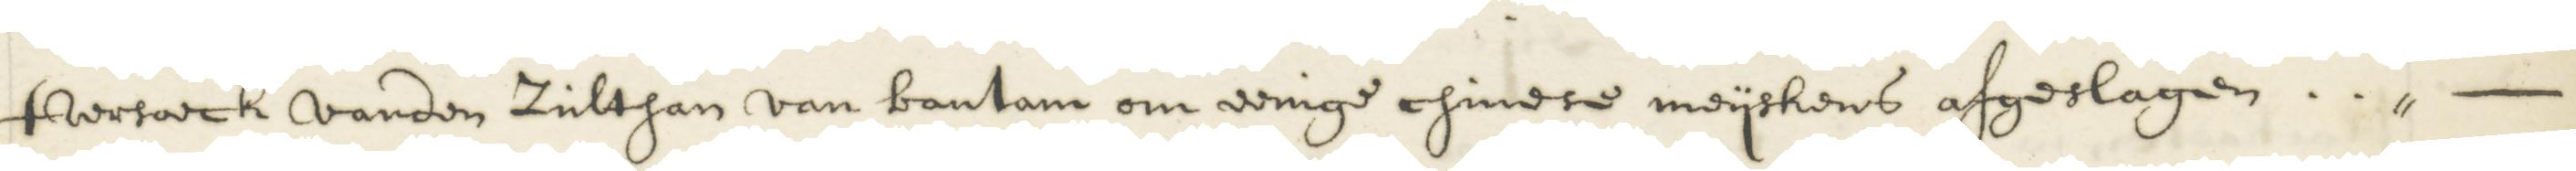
t versoeck vanden zulthan van bantam om eenige chinese meijskens afgeslagen - - „ —
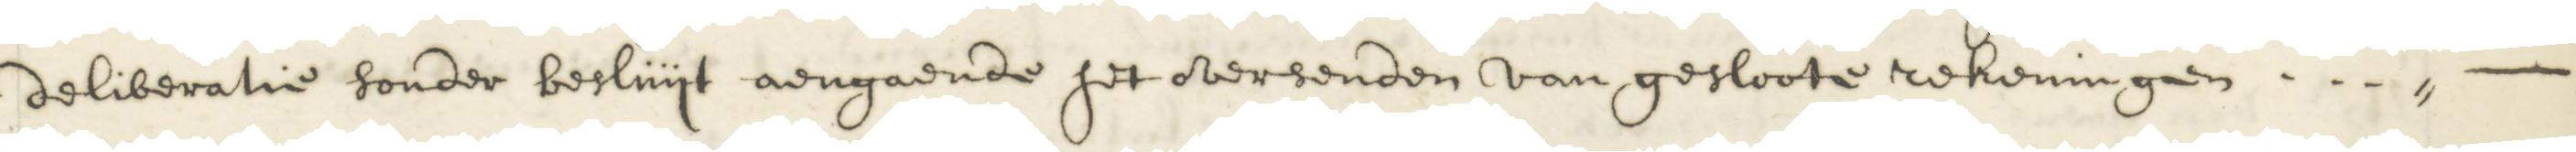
deliberatie sonder besluijt aengaende het oversenden van gesloote rekeningen - - - „ —
